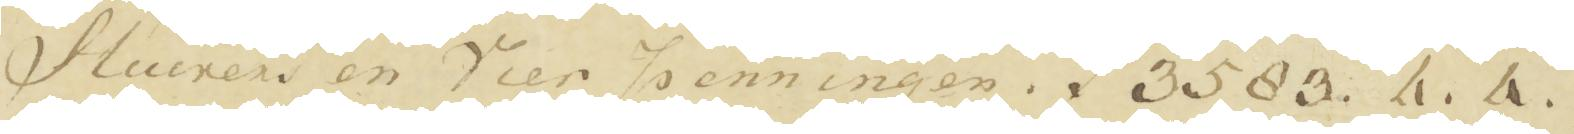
Stuivers en Vier penningen. ƒ 3583. 4. 4.
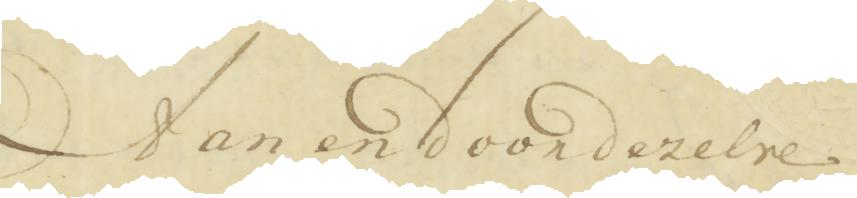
Aan en door dezelve
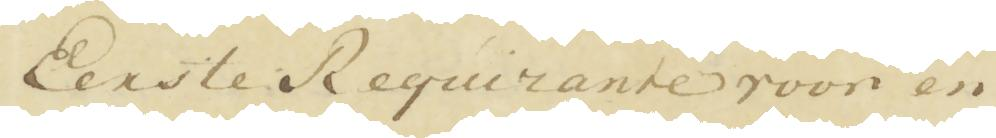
Eerste Requirante voor en
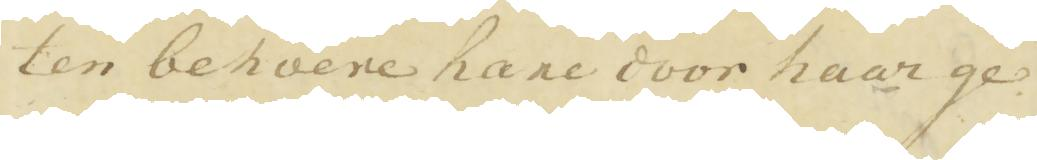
ten behoeve hare door haar ge,
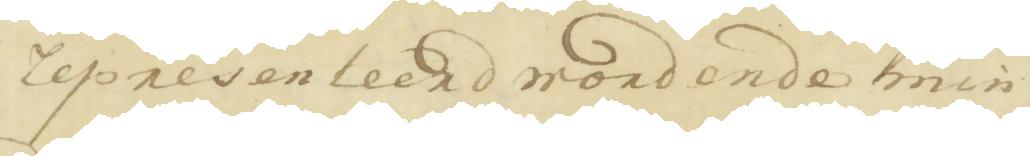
representeerd wordende min
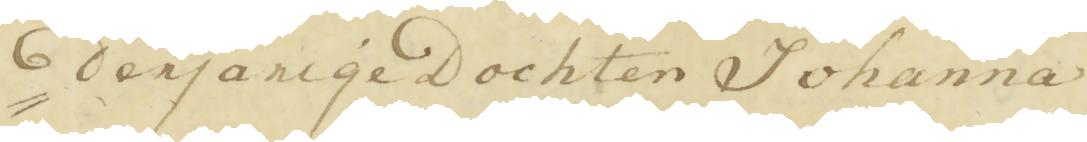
=derjarige Dochter Johanna
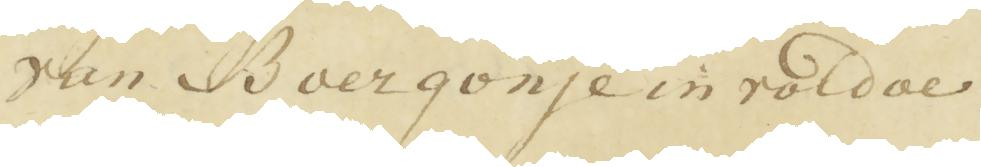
van Boergonje in voldoe.
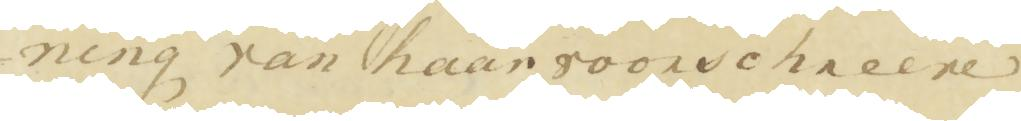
=ning van haar voorschreeve
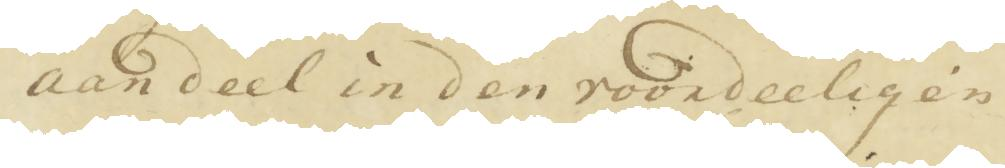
aan deel in den voordeeligen
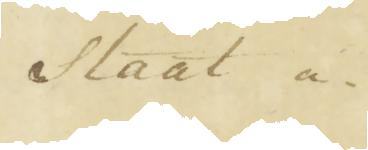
staat à . . . . . ƒ511. 17. 12.
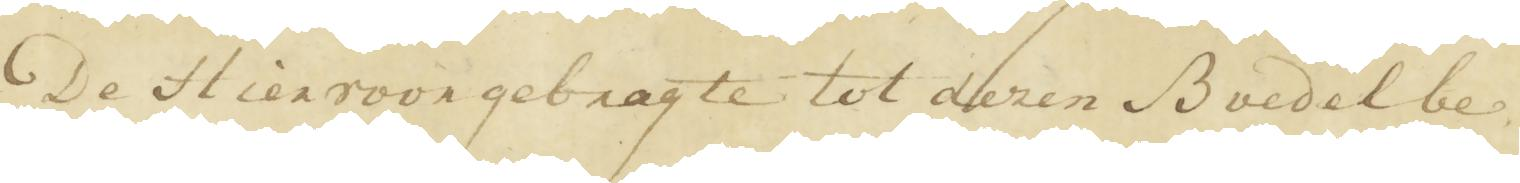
De Hiervoor gebragte tot dezen Boedel be„
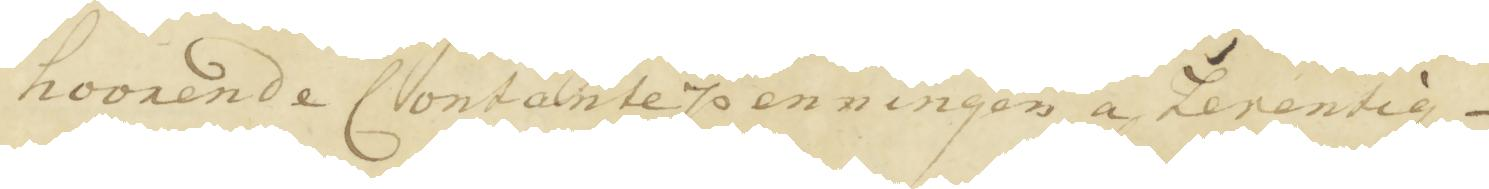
=hoorende Contante penningen a zeventig –
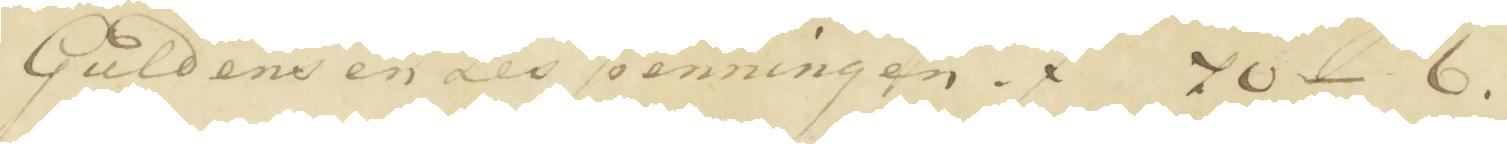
Guldens en Zes penningen . ƒ 70 — 6.
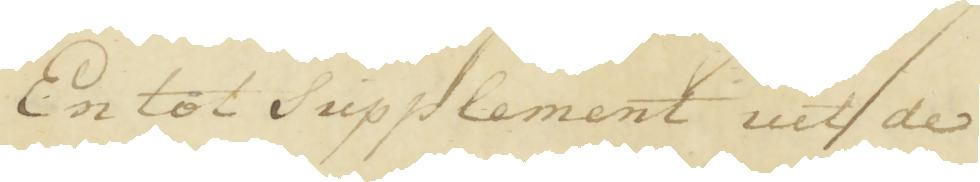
En tot supplement uit de
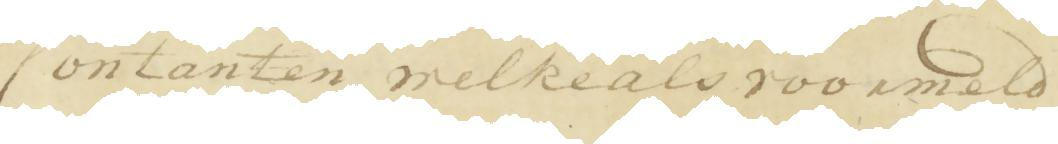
Contanten, welke als voormeld
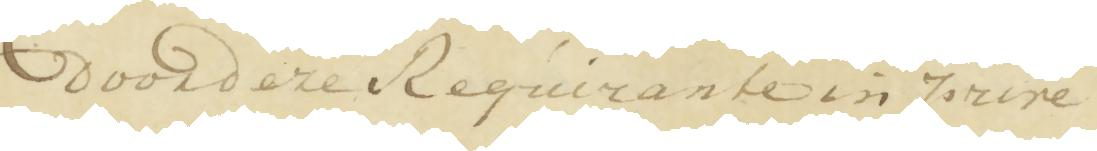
door deze Requirante in privé
